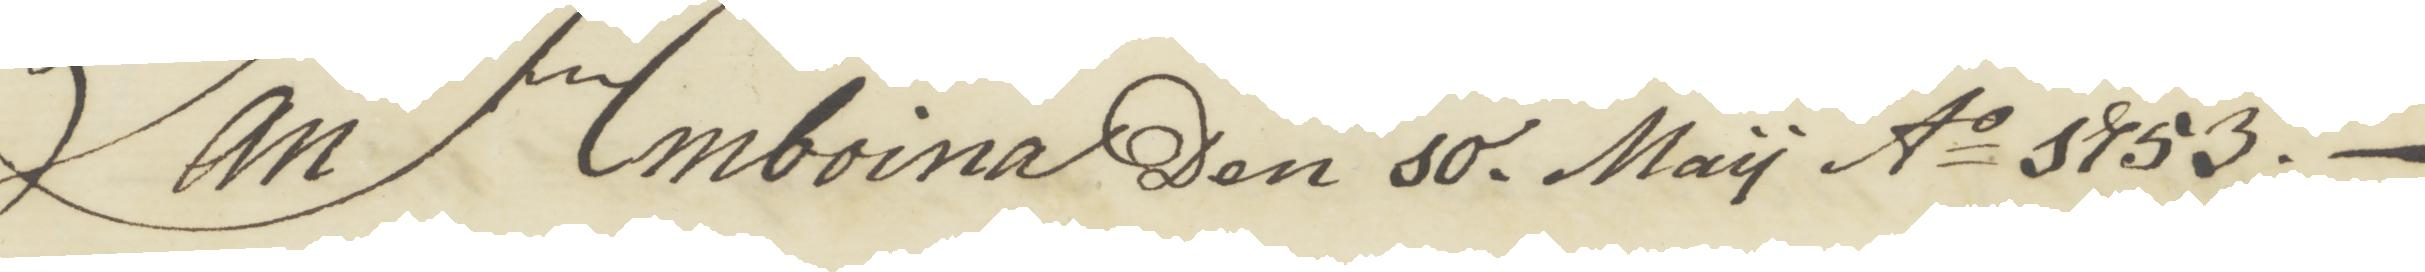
Van Amboina Den 10.' Maij A=o 1753. —
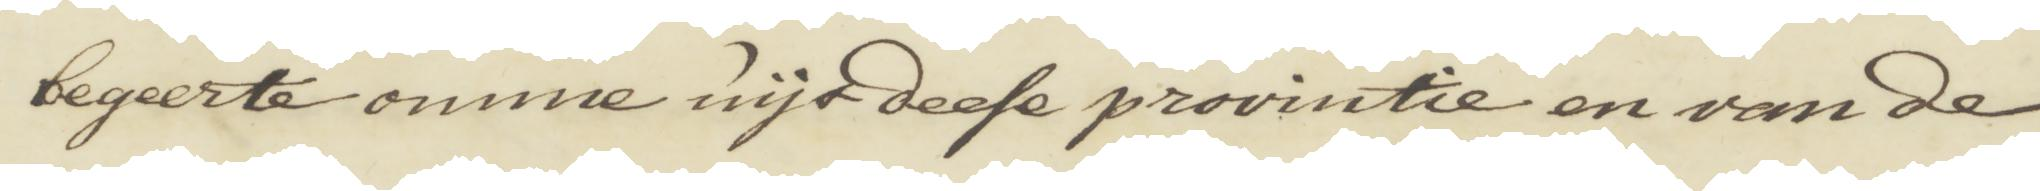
begeerte omme uijt deese provintie en van de
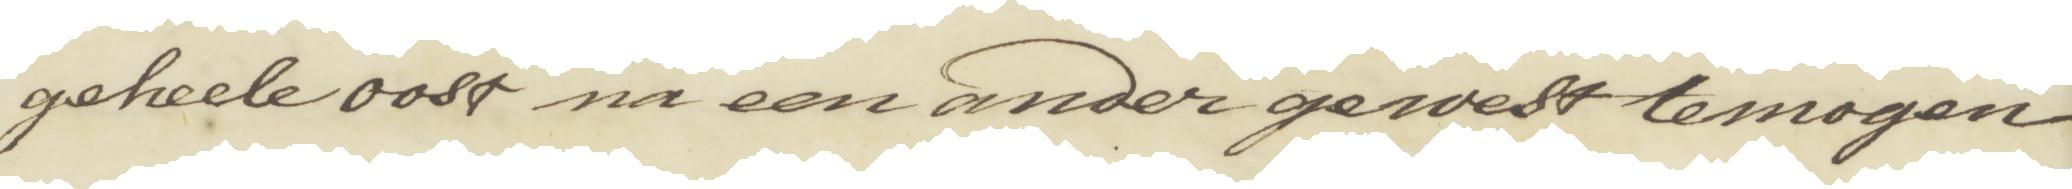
geheele oost na een ander gewest temogen
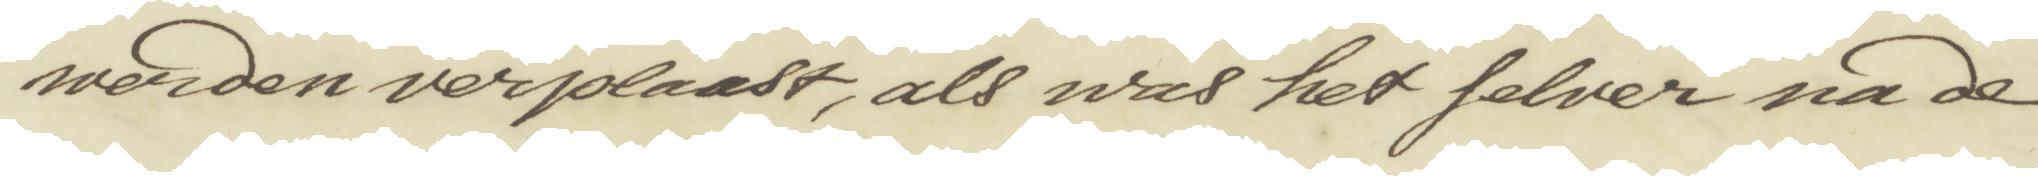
werden verplaast, als was het selver na de
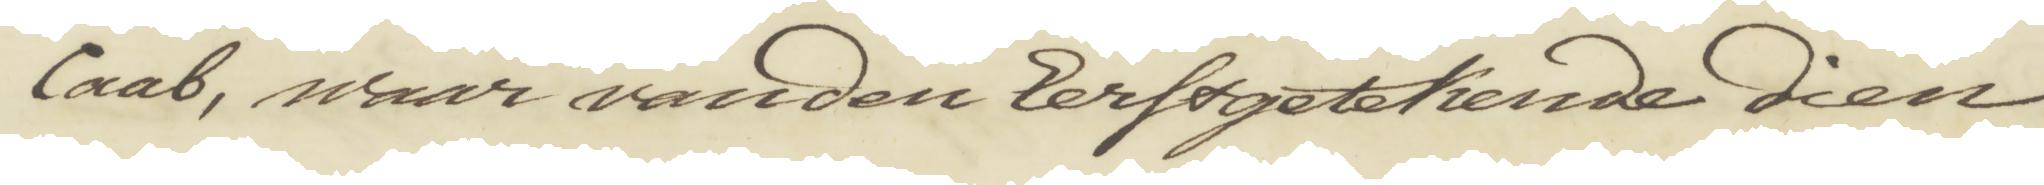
Caab, waar van den Eerstgetekende dien
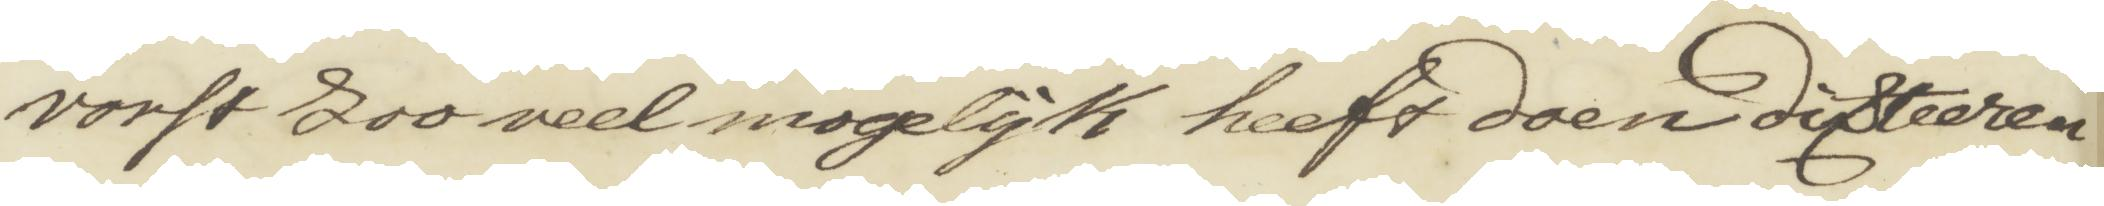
vorst Zoo veel mogelijk heeft doen diverteeren
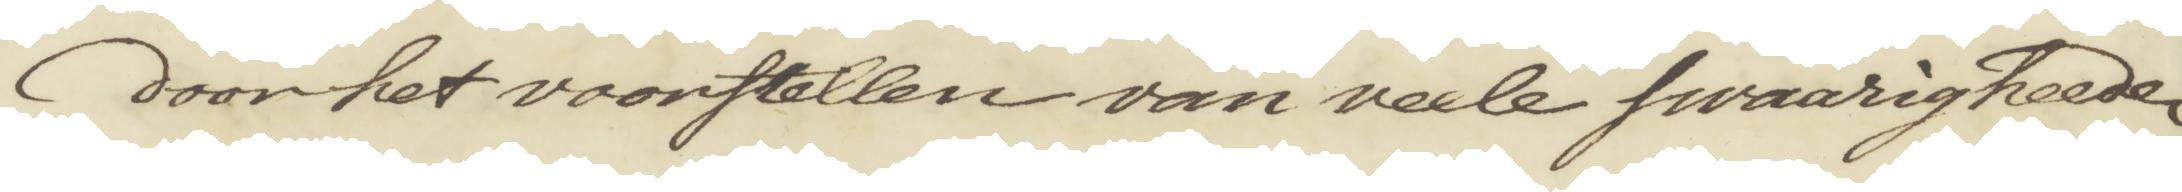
door het voorstellen van veele swaarigheeden
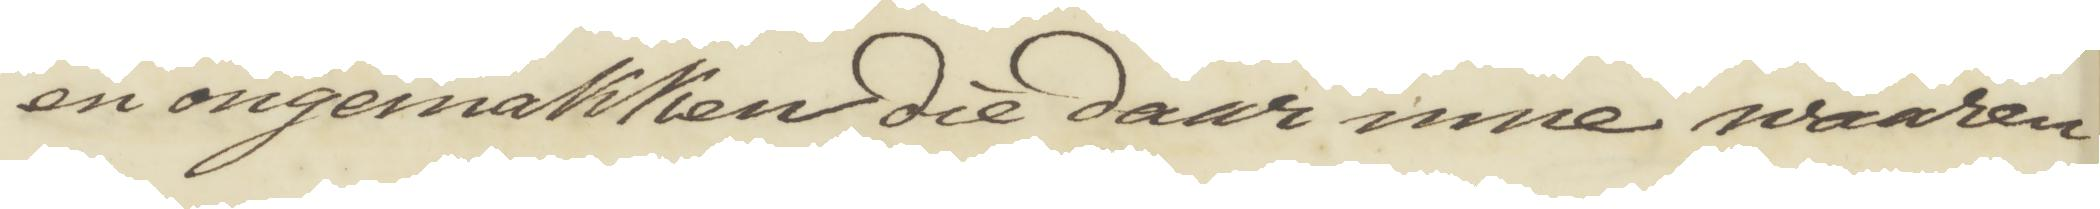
en ongemakken die daar inne waaren
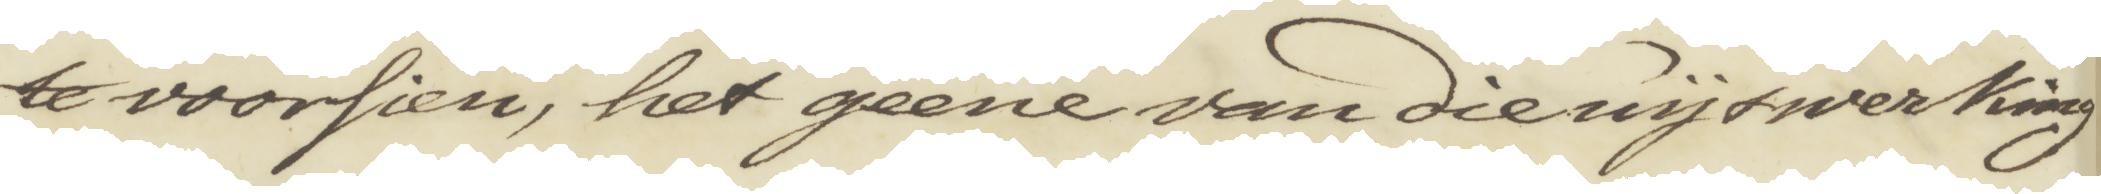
te voorsien, het geene van die uijtwerking
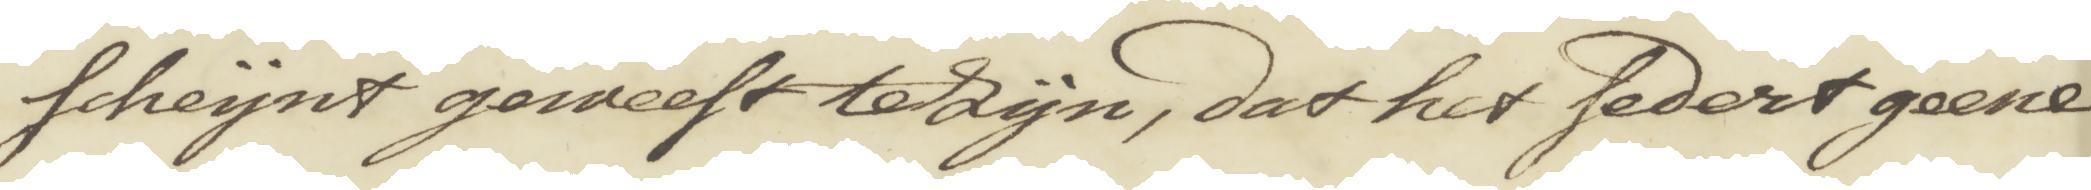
scheijnt geweest te zijn, dat het sedert geene
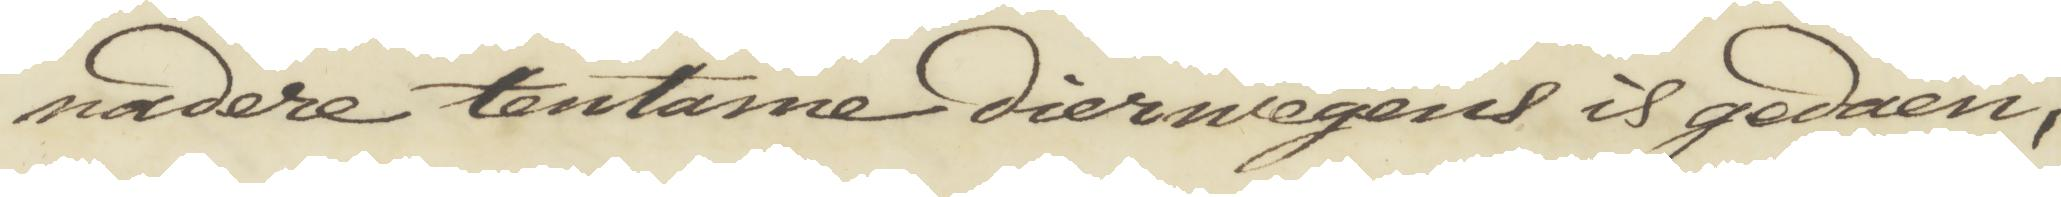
nadere tentame dierwegens is gedaen,
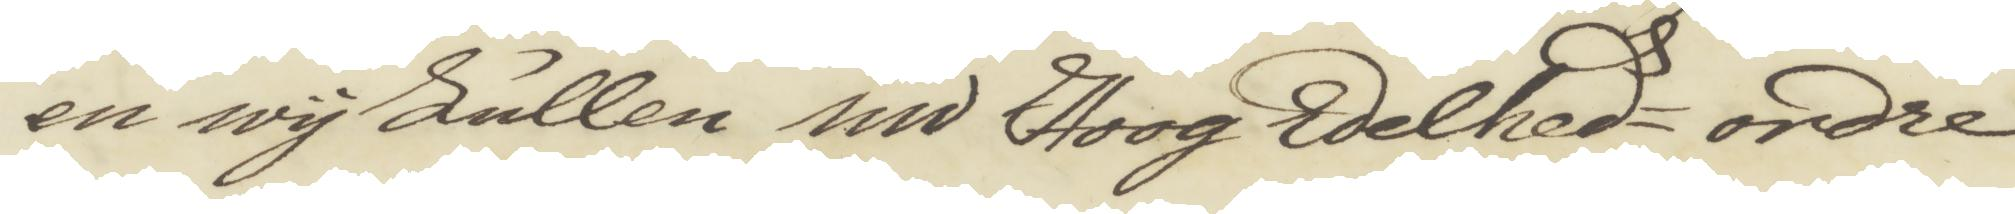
en wij Zullen uw Hoog Edelhed=s ordre
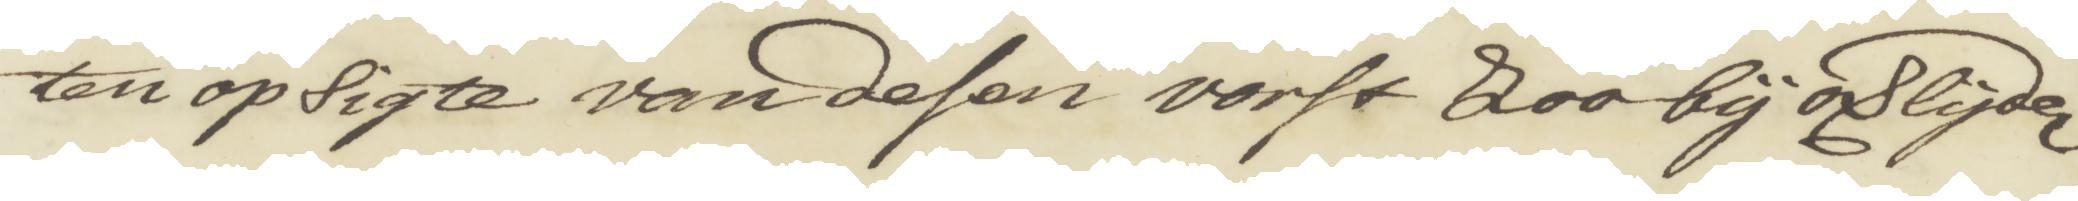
ten op sigte van desen vorst Zoo bij overlijden
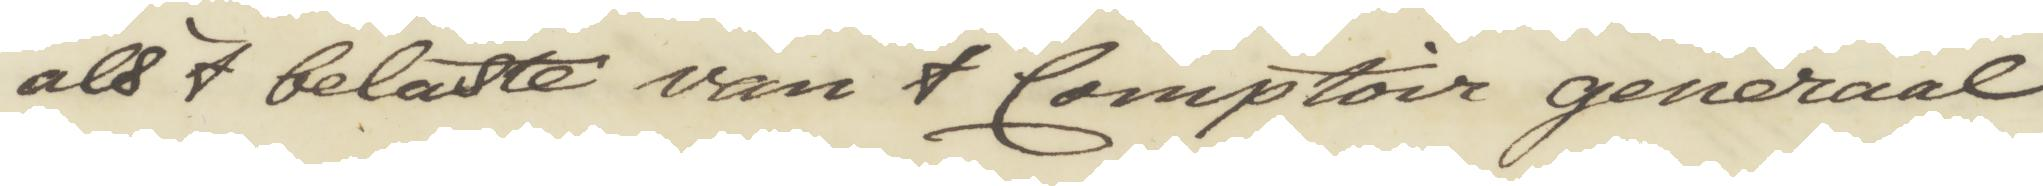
als ’t belaste van ’t Comptoir generaal
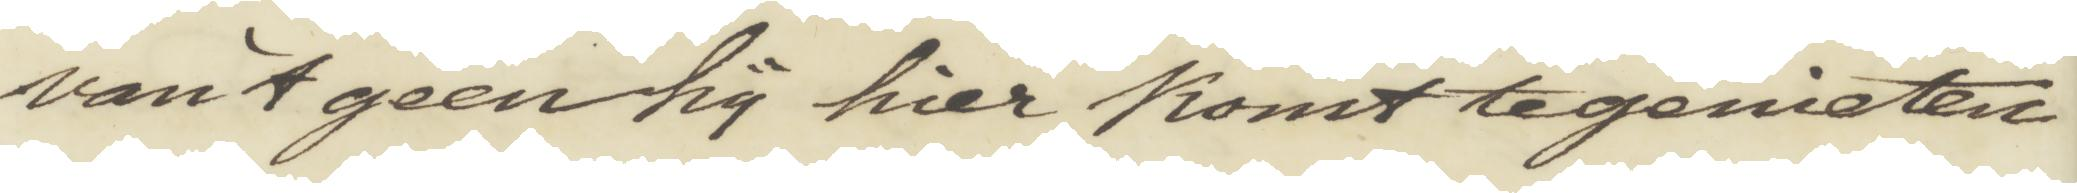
van ’t geen hij hier komt te genieten
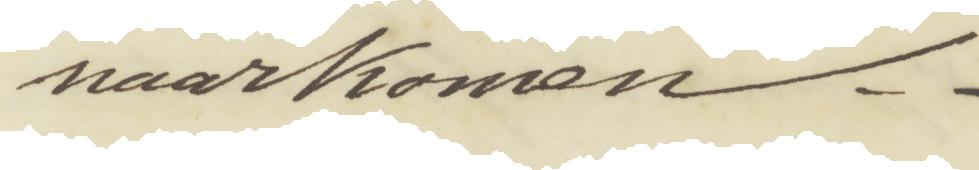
naar komen. -
